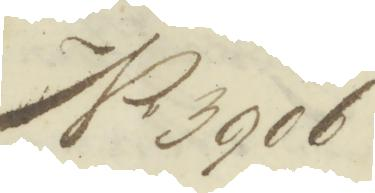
N:o 3906
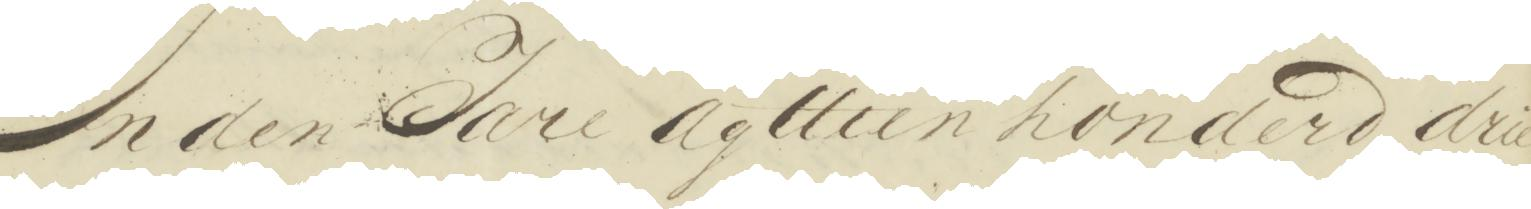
In den Jare agttien honderd drie
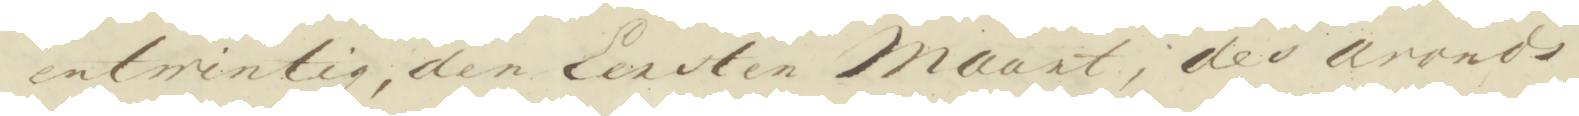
en twintig, den Eersten Maart, des avonds
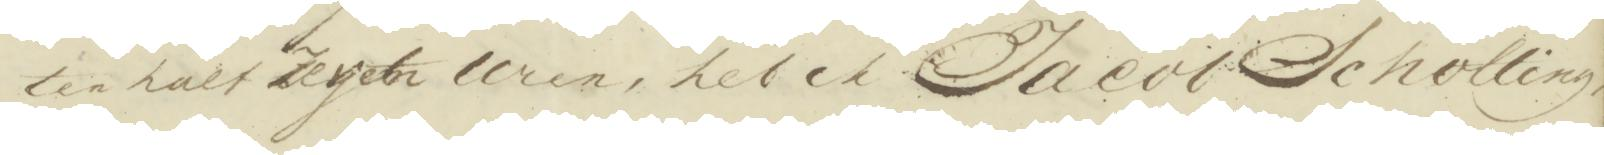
ten half Zeven uren, heb ik Jacob Scholting,
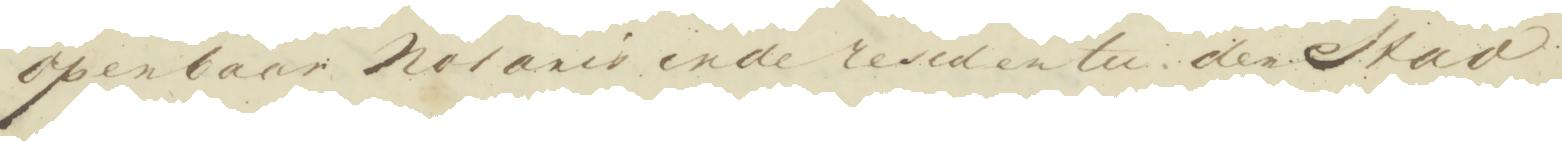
open baar Notaris in de residentie der Stad
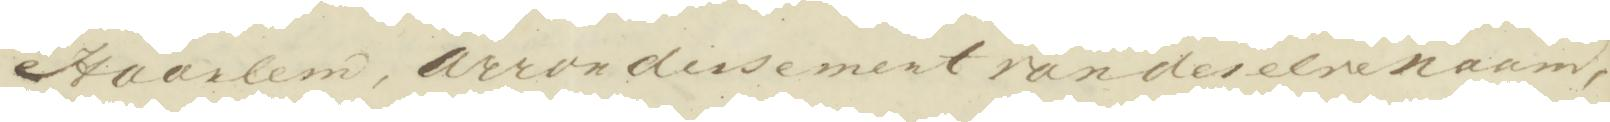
Haarlem, Arrondissement van deselve naam,
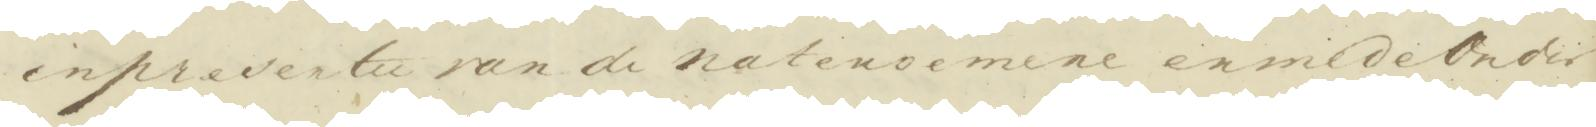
in presentie van de na te noemene en mede onder
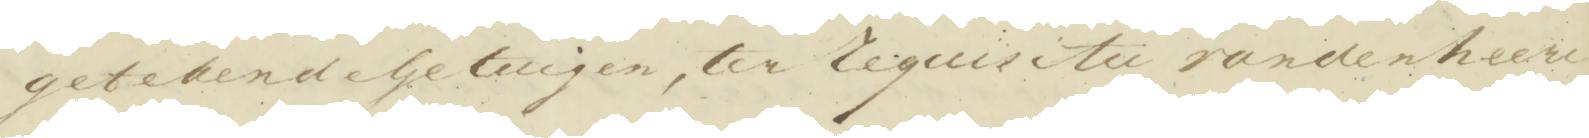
getekende getuigen, ter requisitie van den heere
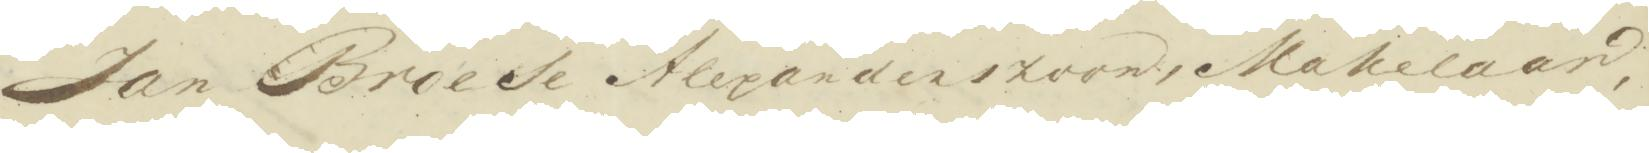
Jan Broese Alexanders zoon, Makelaar,
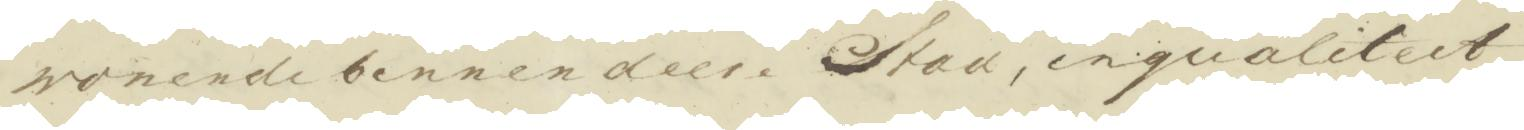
wonende binnen deese Stad, in qualiteit
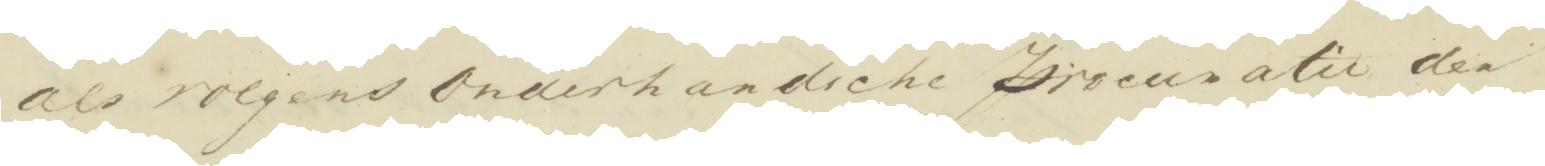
als volgens onderhandsche Procuratie den
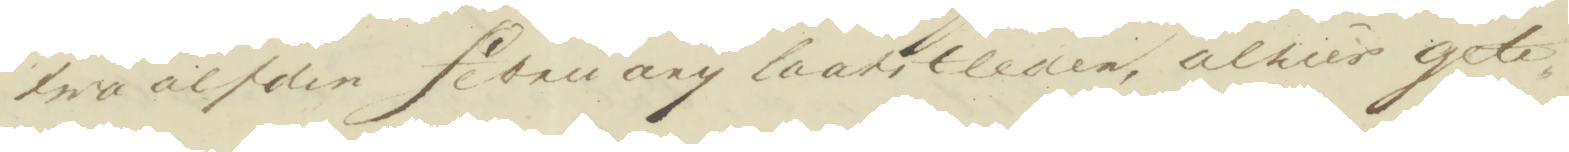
twaalfden Februarij laatstleden, alhier gete„
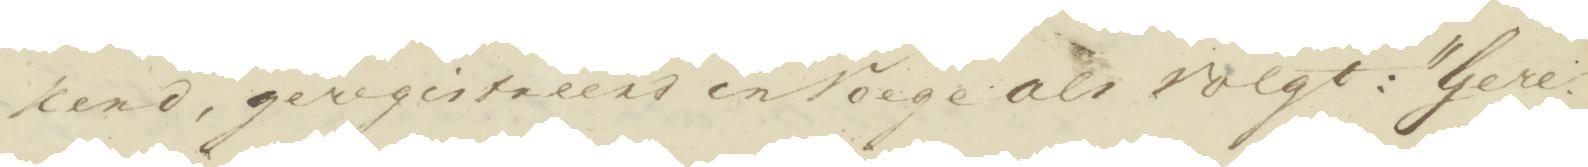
kend, geregistreerd in voege als volgt: "Gere„
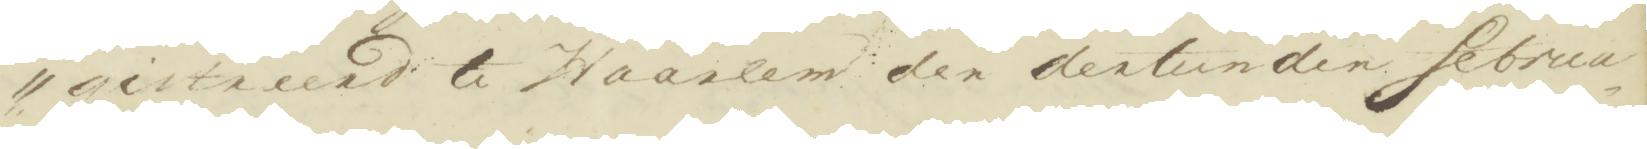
„gistreerd te Haarlem den dertienden februa„
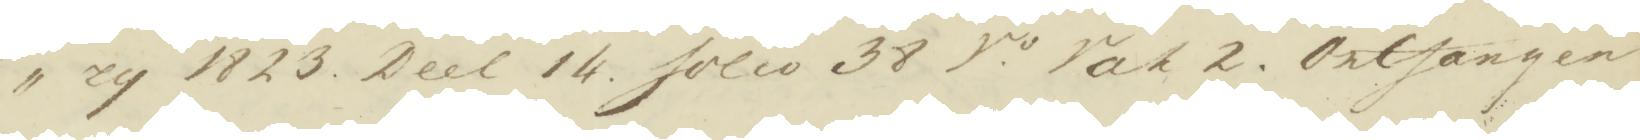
„ry 1823. Deel 14. folio 38 V.o Vak 2 Ontfangen
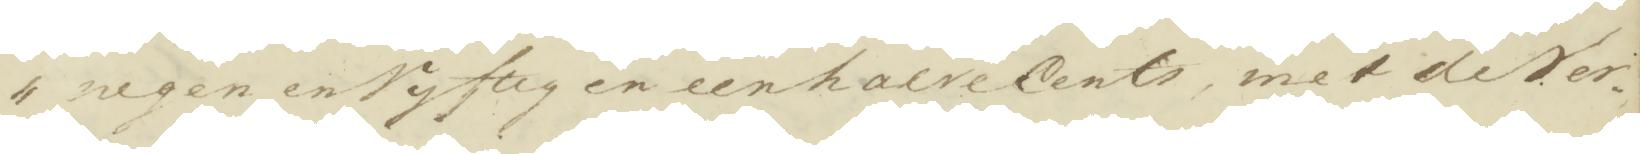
„negen en Vyftig en een halve Cents met de Ver„
